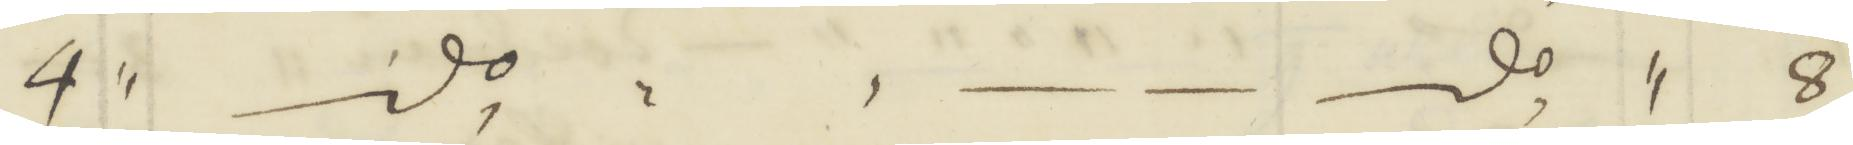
4„ _,o „ „ — — d„o „ 8
